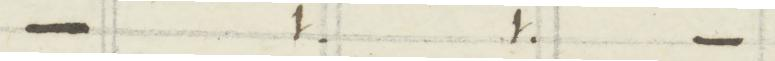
— 1. 1. —
